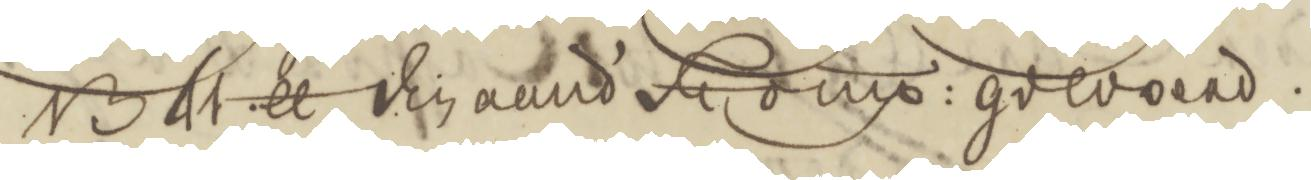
1341 lb thin aan d'Ecomp: geleverd.
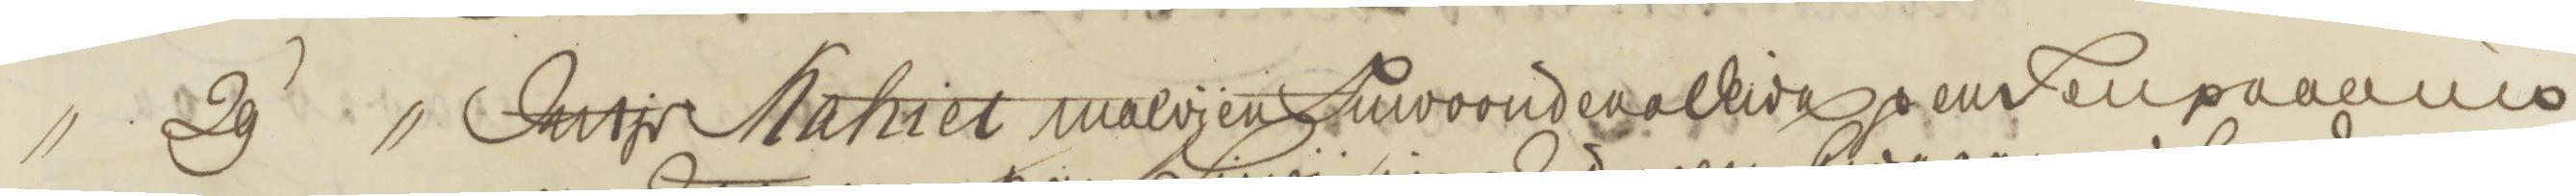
„ 29' „ Intje Kahiet maleijer Inwoonder alhier per Een praauw
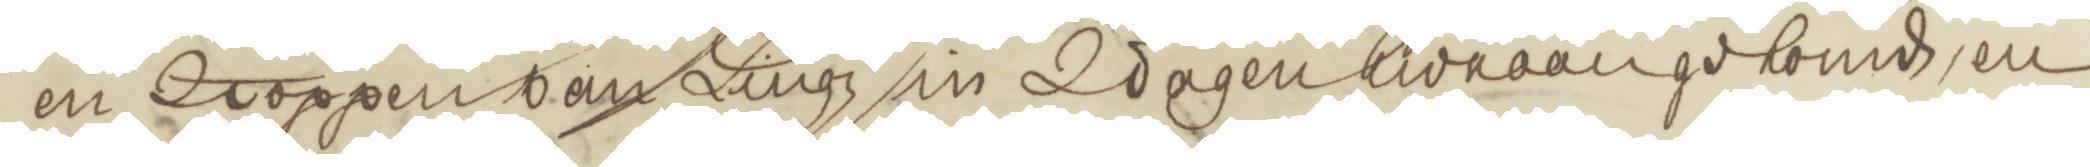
en 2 coppen van Lingij in 2 dagen hier aangekomen, en
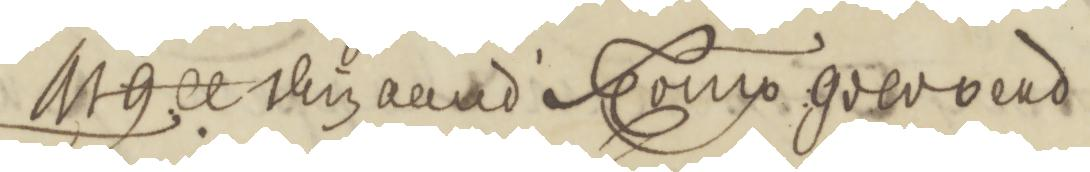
419 lb thin aan d’ Ecomp: geleverd
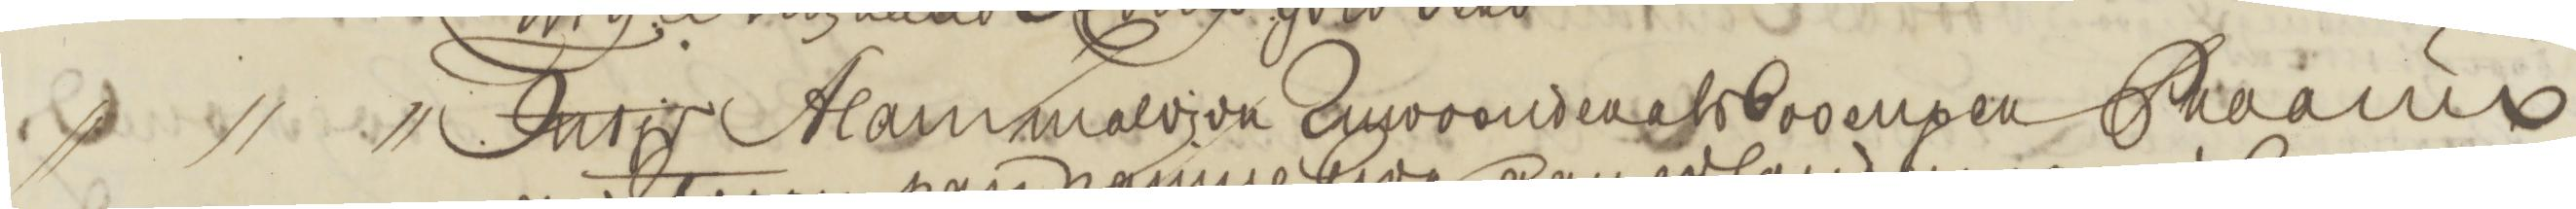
„ „ „ Intje Alam maleijer Inwoonder als boven per Praauw
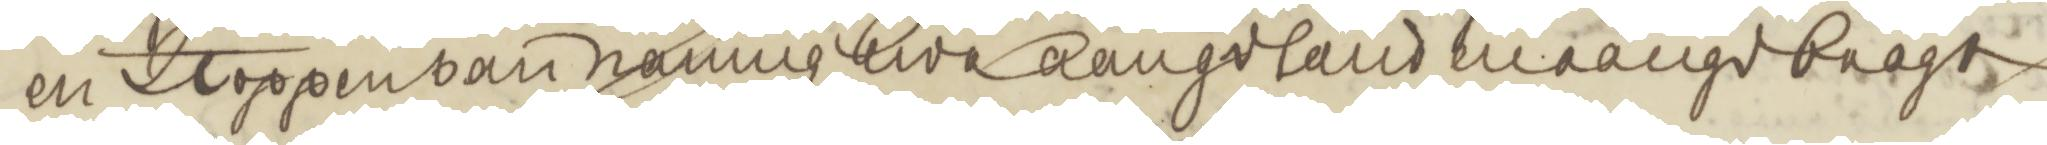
en 2 coppen van naning hier aangeland en aangebragt
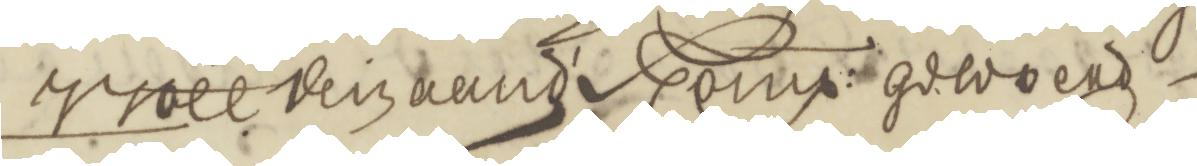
770 lb thin aan d’ EComp:' geleverd
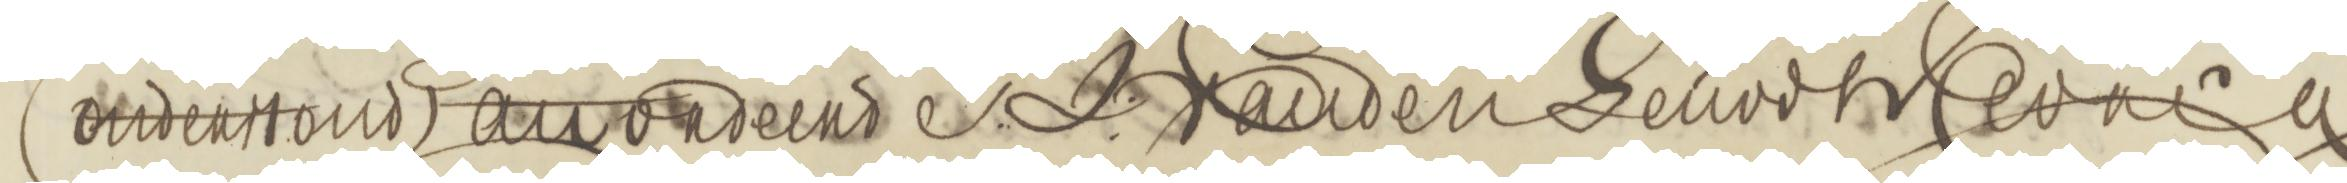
(onderstond) accordeerd T:I: vanden heuvel E Clercq.
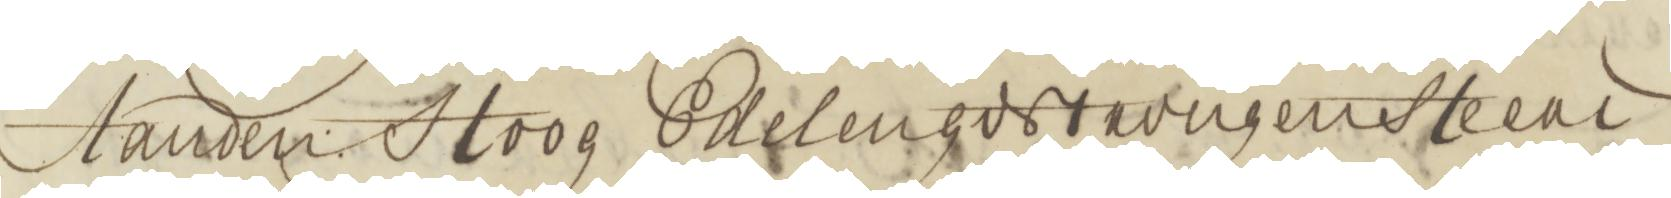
Aan den: Hoog Edelen gestrengen Heere
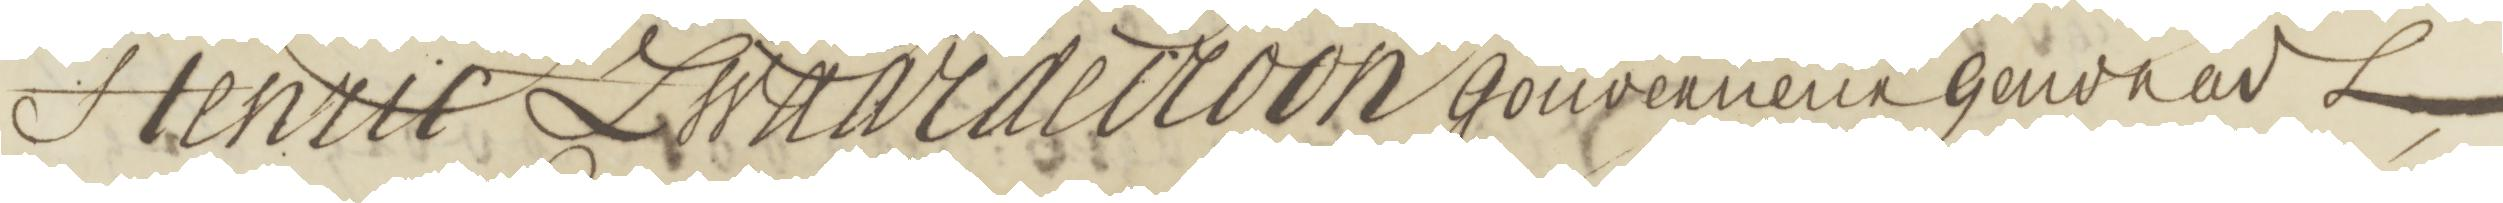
Henric Zwaardecroon gouverneur generael
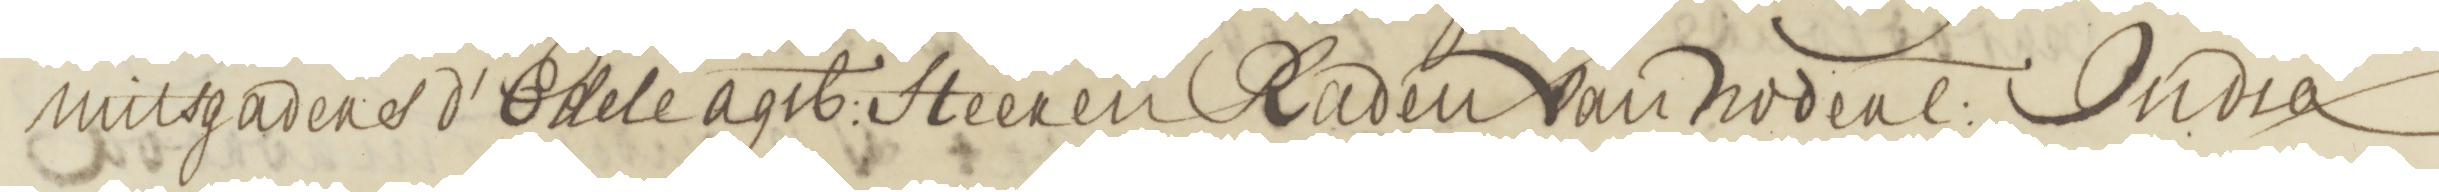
mitsgaders d’Edele agtb: Heeren Raden van Nederl: India
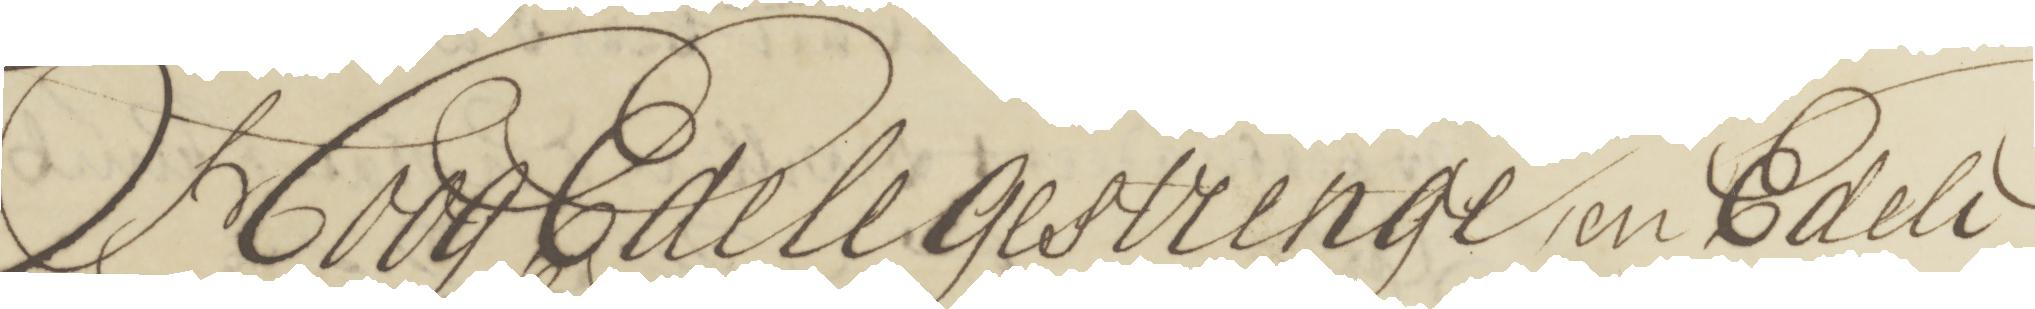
Hoog Edele gestrenge, en Edele
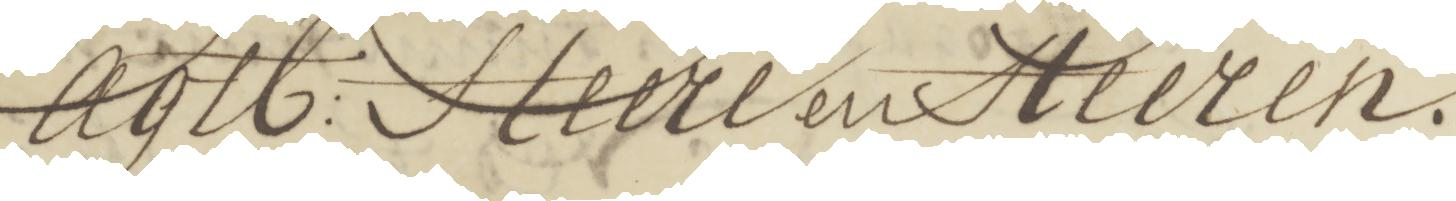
Agtb: Heere en Heeren.
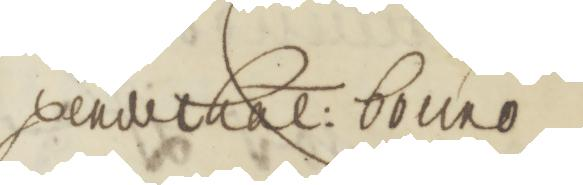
per de chal: bouro
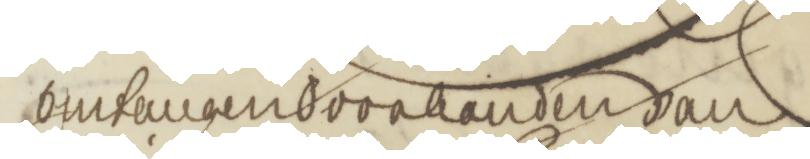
ontfangen door handen van
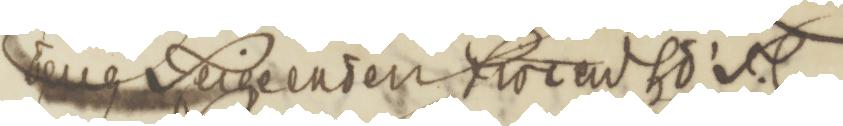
den g' Eligeerden fiscael d' E.
